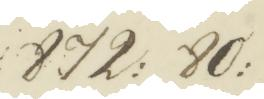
872: 80:
